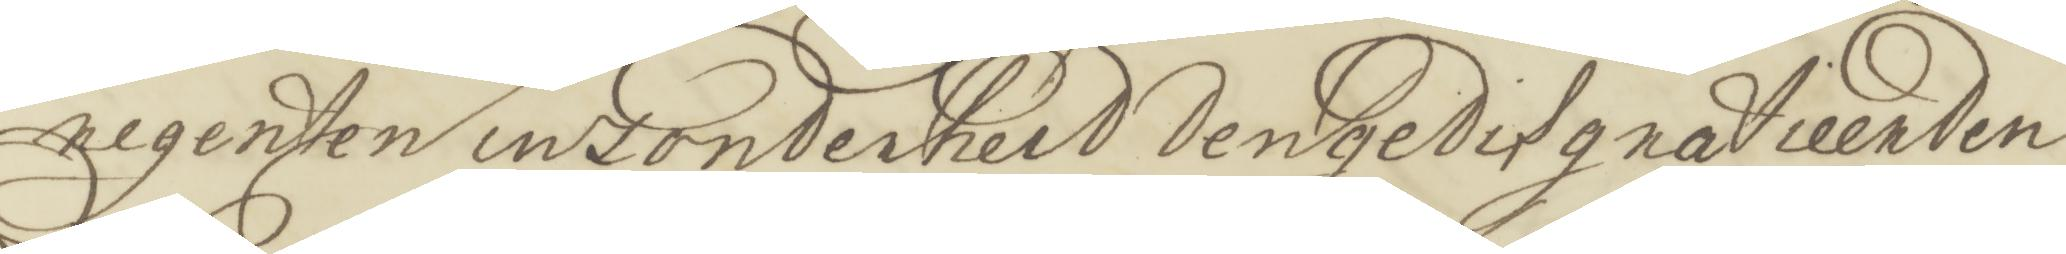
regenten in zonderheid den gedisgratieerden
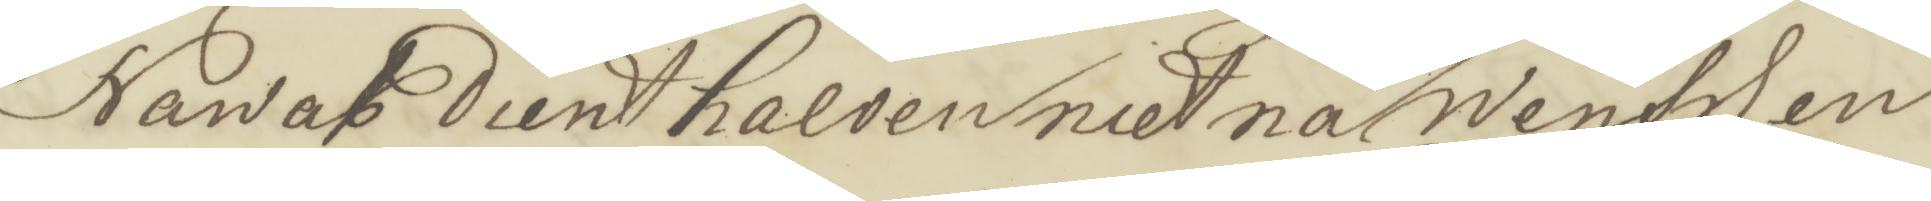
Nawab dient halven niet na Wenschen
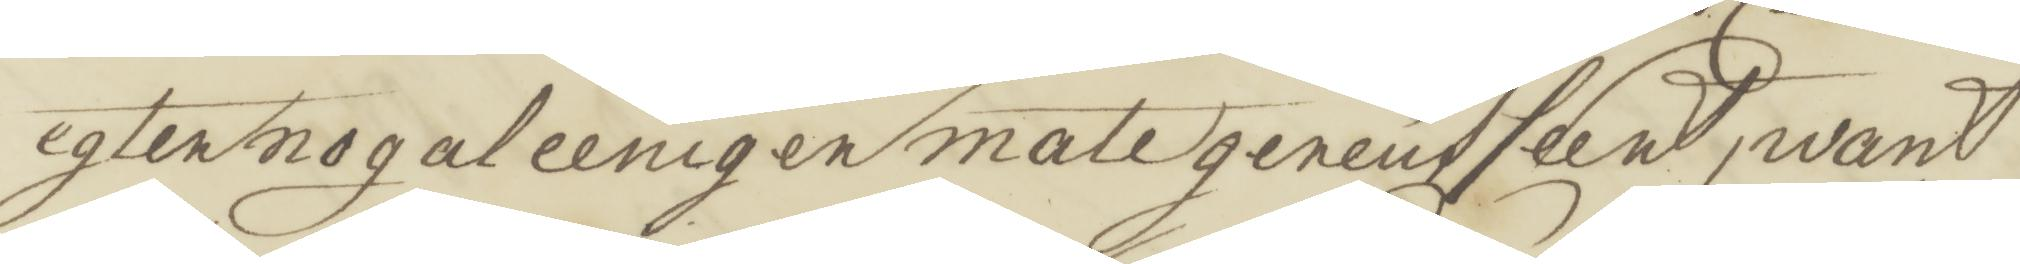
egter nog al eenigen mate gereusseert, want
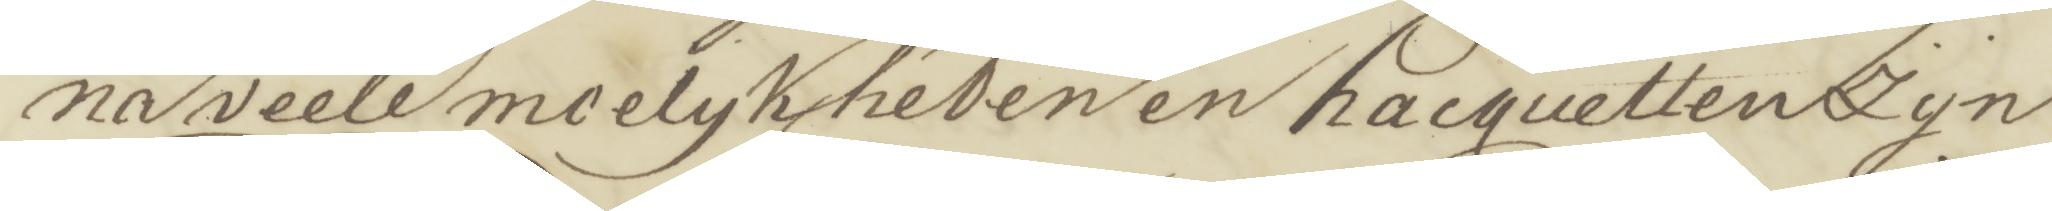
na veele moelijkheden en hacquetten zijn
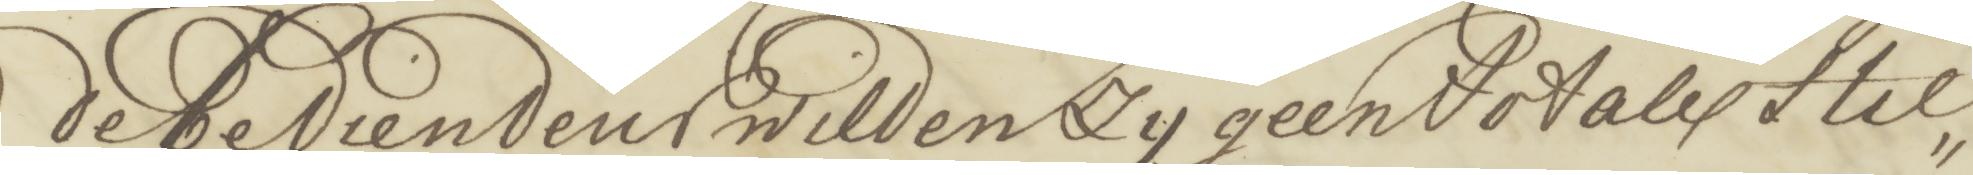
de bediendens wilden zij geen Totale stil„
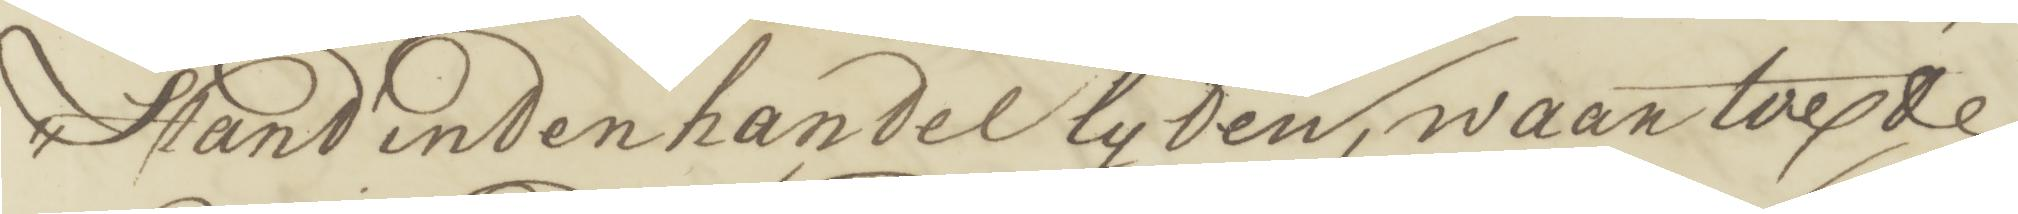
Stand in den handel lyden, waar toe de
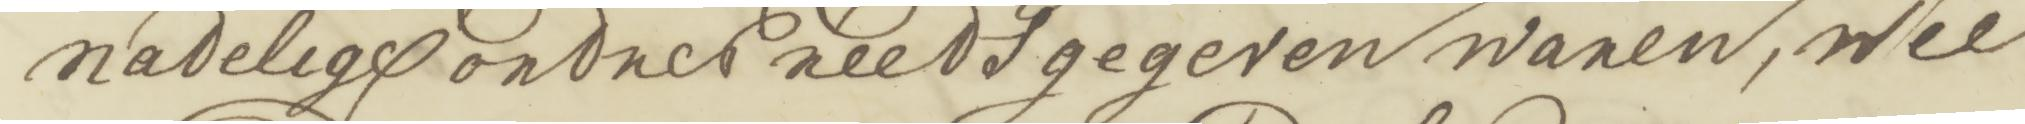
nadelige ordres reedsgegeven waren, wel
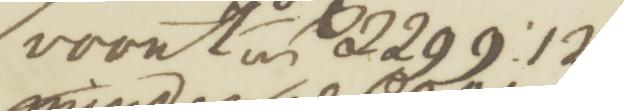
voor R:o/a :s 2299:12
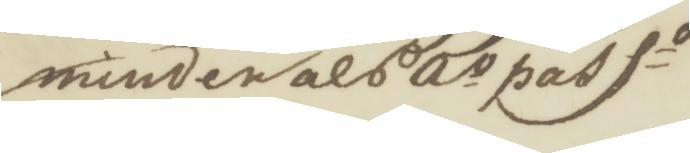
minder als a=o pass=o
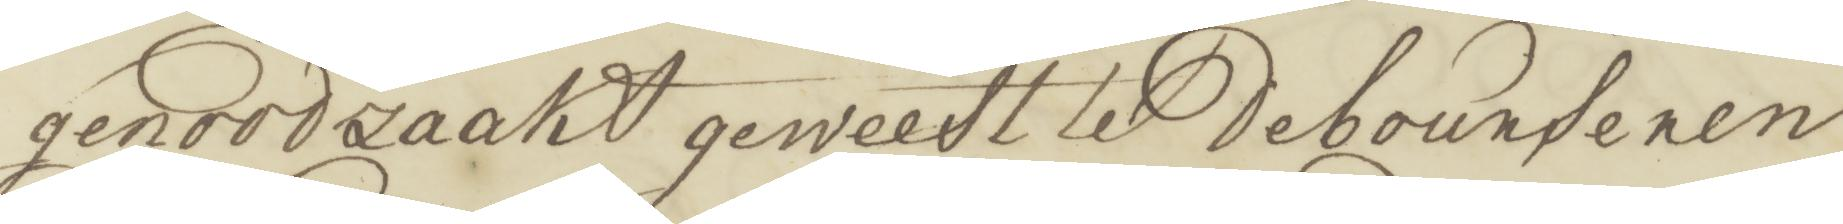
genoodzaakt geweest te debourseren
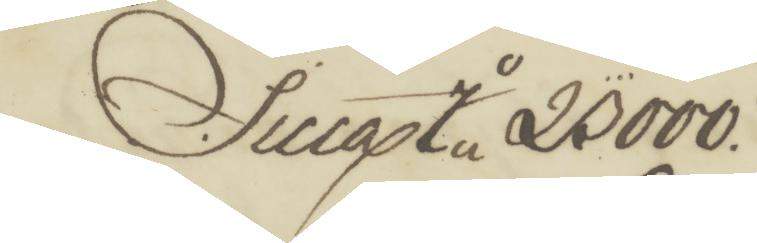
Sicca R:o/au 23000.
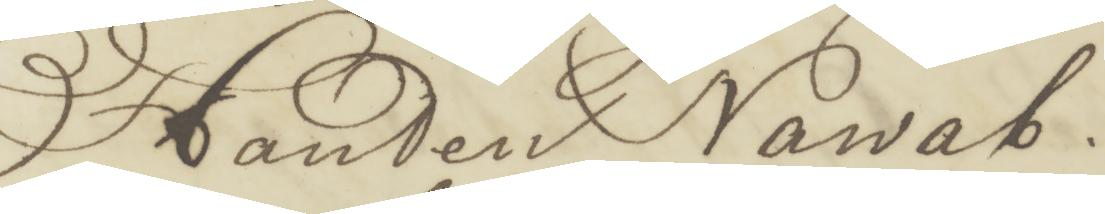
Aanden Nawab.
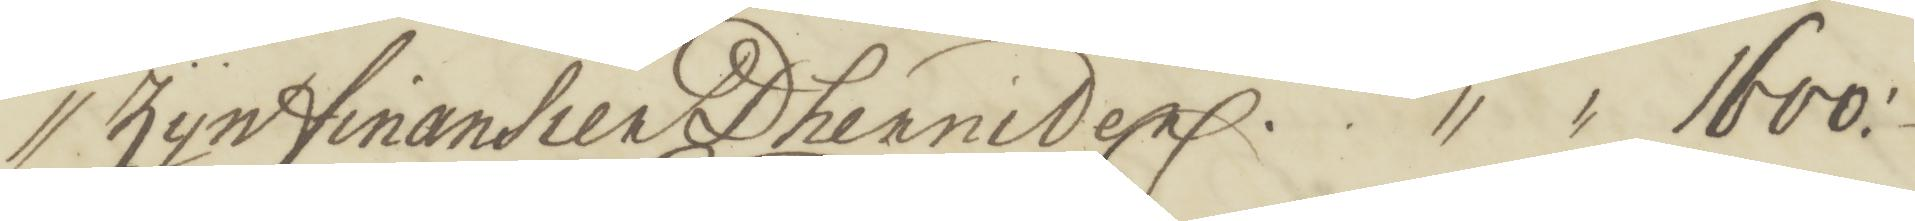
„ zijn finansier Dherneder . . „ „ 1600:
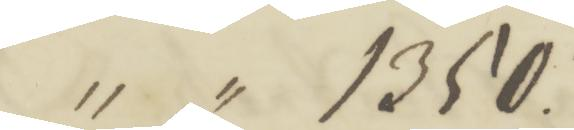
„ „ 1350.
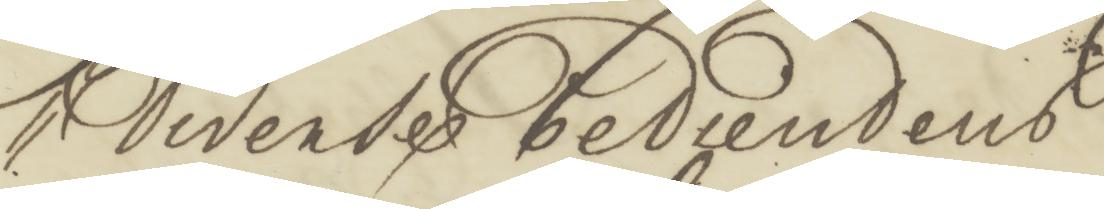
„ diverse bediendens
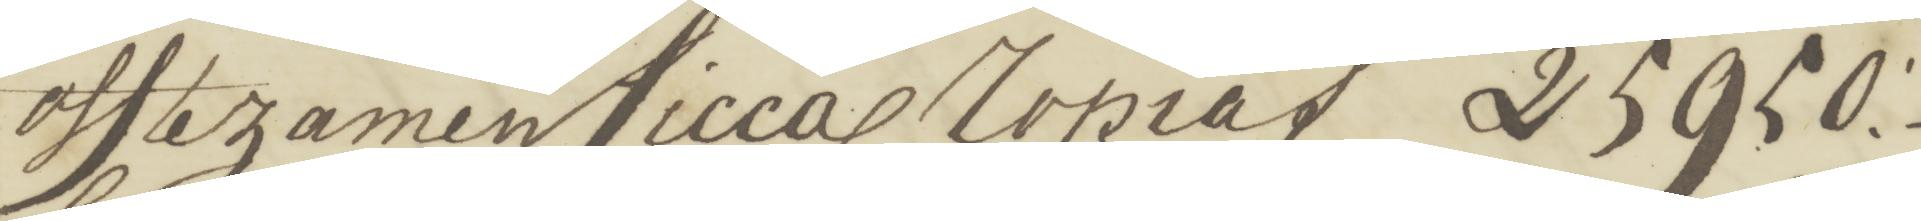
off tezamen Sicca ropias 25950:
